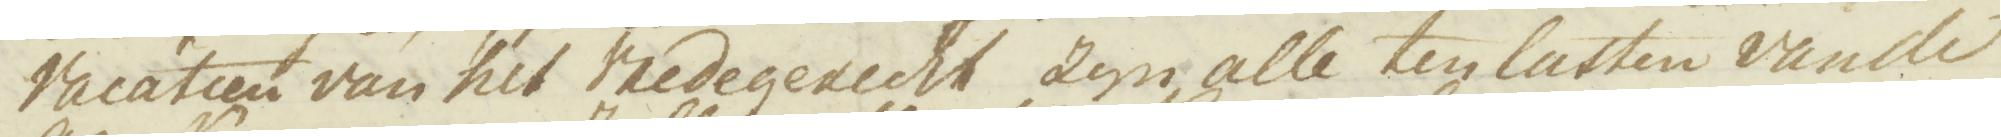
Vacatien van het Vredegerecht Zyn alle ten lasten van de
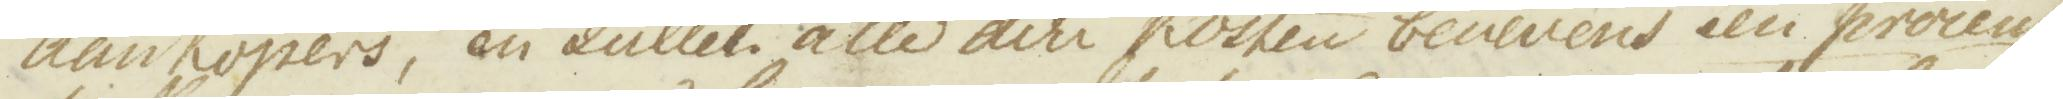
aankopers, en Zullen alle deze kosten benevens een procent
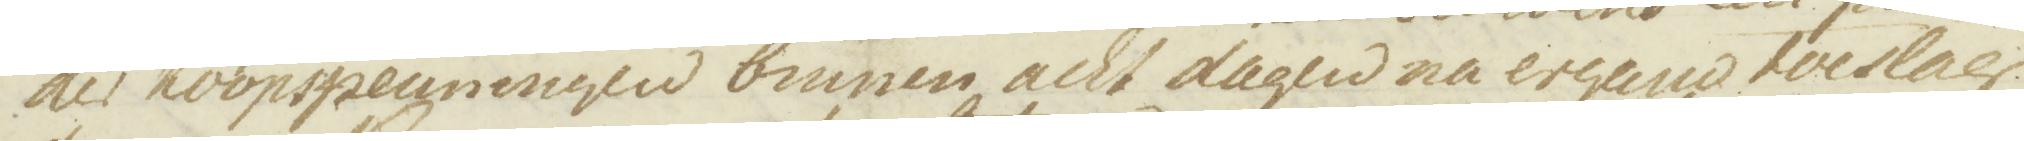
der koopspenningen binnen acht dagen na ergand toeslag.
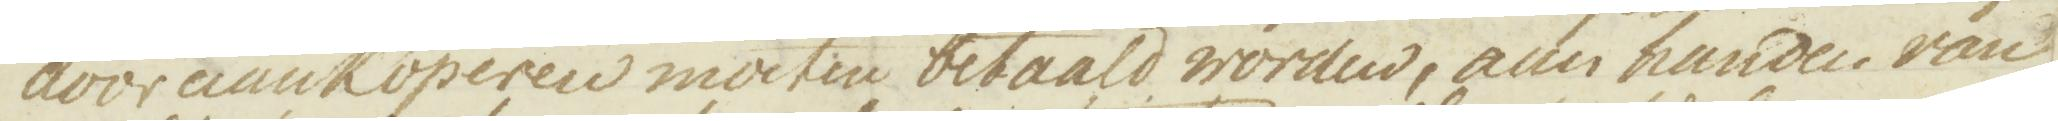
door aankoperen moeten betaald worden, aan handen van
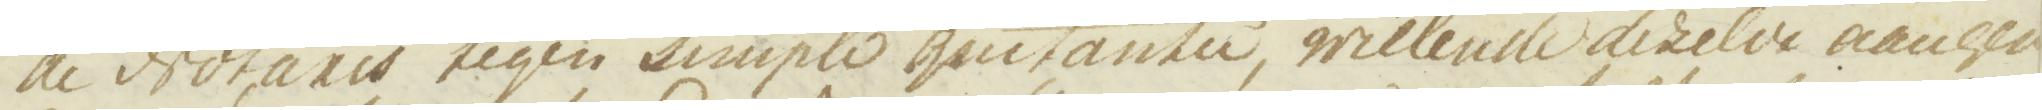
de Notaris tegen Simple quitantie, willende dezelve aanged
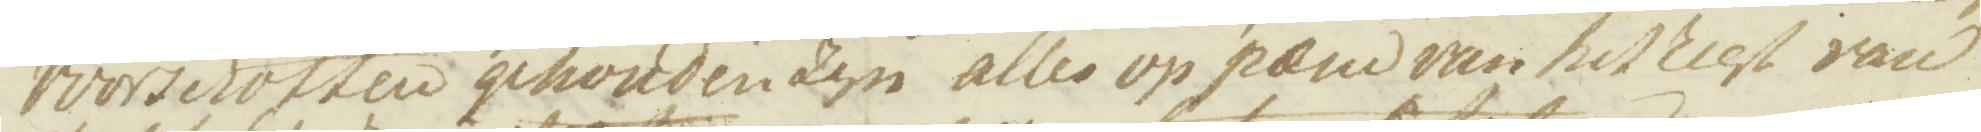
voorschotten gehouden zyn alles op paene van het regt van
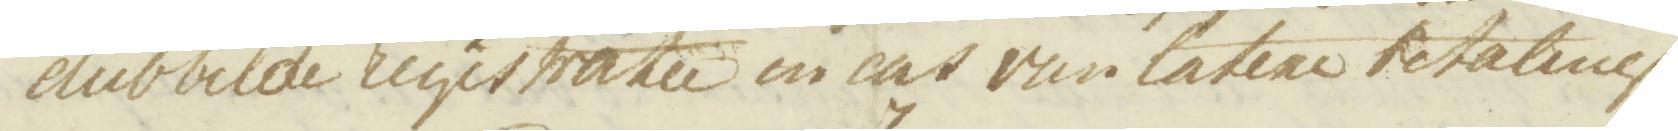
dubbelde registratie en dat van latere betaling
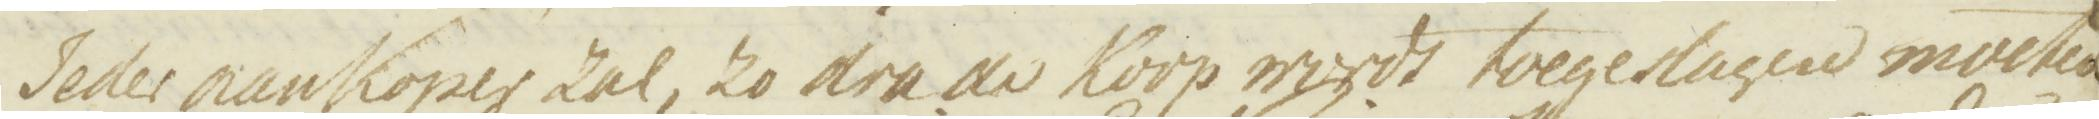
Ieder aankoper Zal, Zo dra de Koop wordt toegeslagen moeten
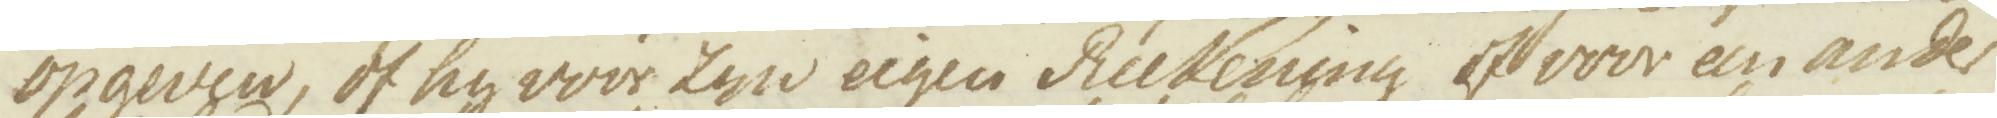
opgeven, of hy voor Zyn eigen Reekening of voor een ander
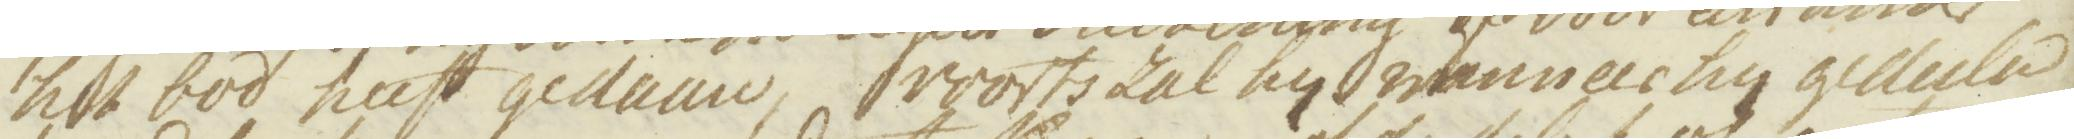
het bod heeft gedaan voorts zal hy wanneer hy gedela
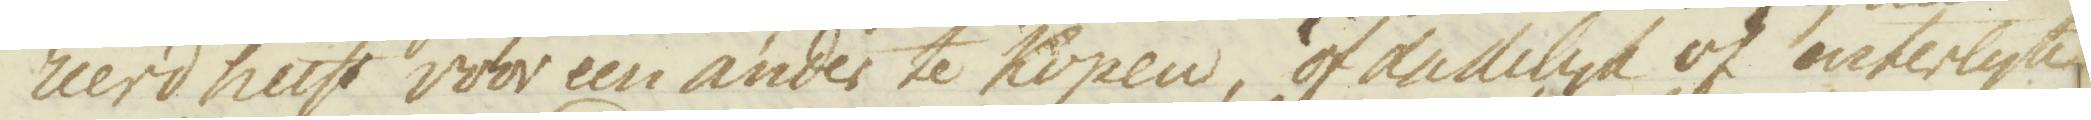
reerd heeft voor een ander te kopen, of dadelyk of uiterlyk
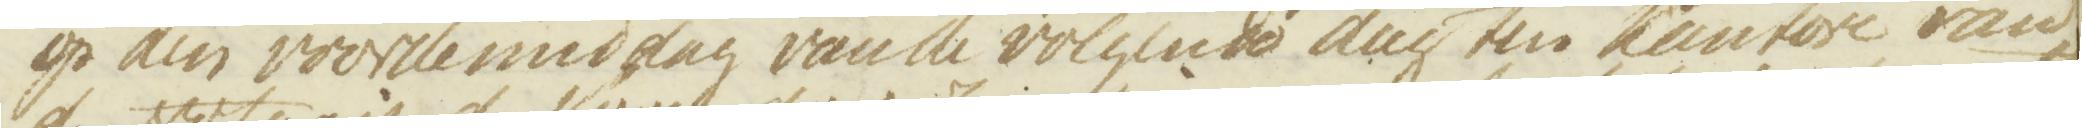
op den voordemiddag van de volgende dag ten kantore van
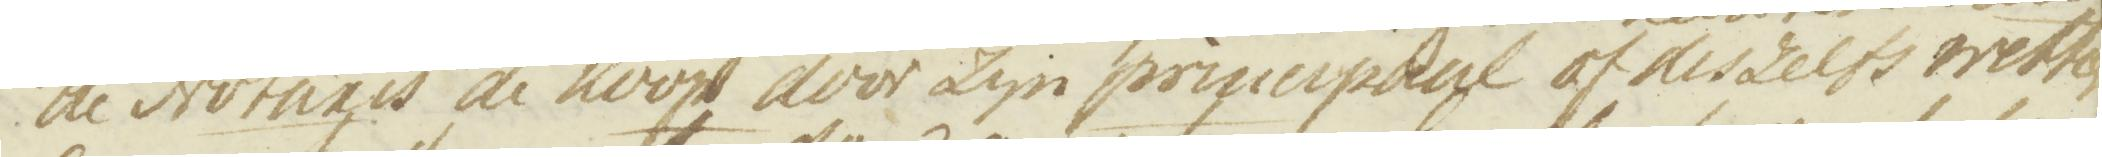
de Notaris de Koop door Zyn principaal of deszelfs wettig
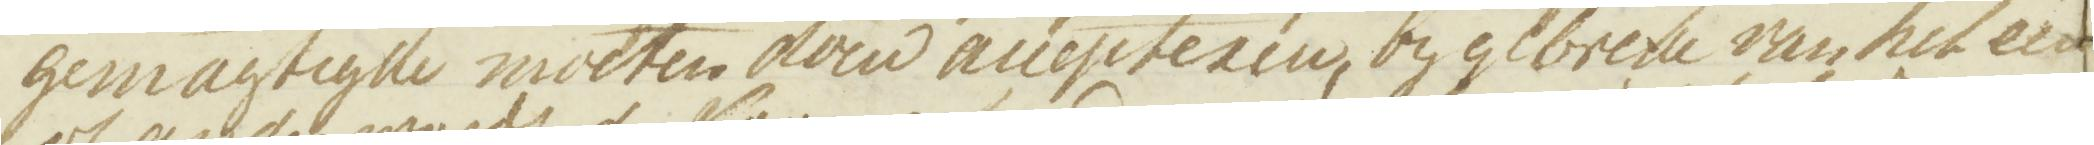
gemagtigde moeten doen auqiteren, by gebreke van het een
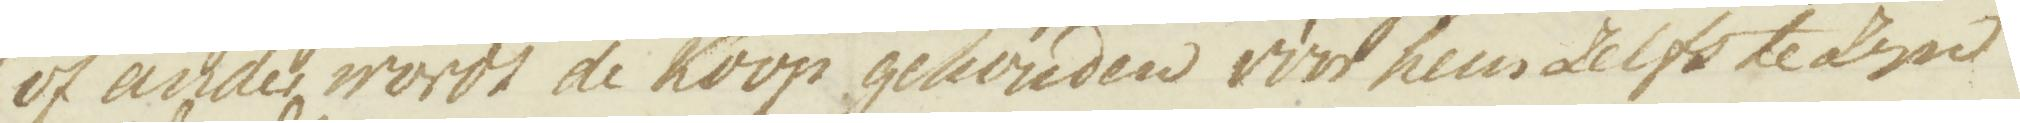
of ander wordt de Koop gehouden voor hem zelfs te Zyn
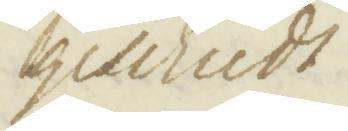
geschiedt
